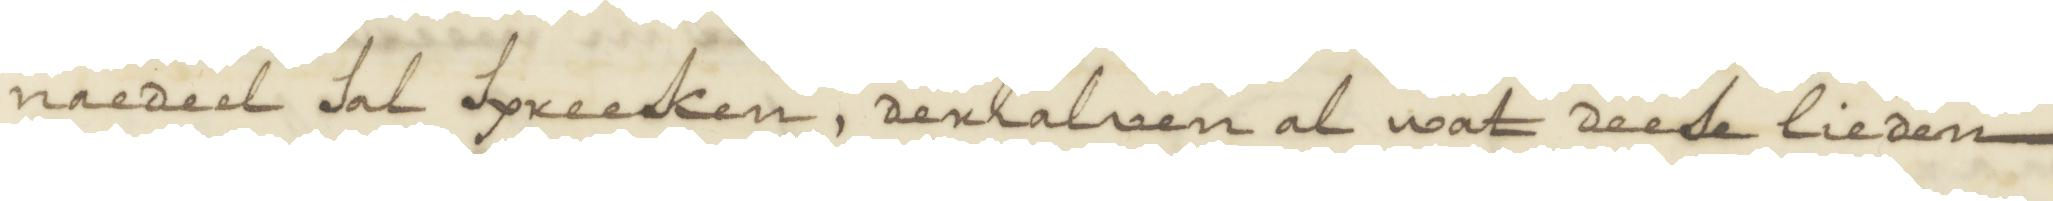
naedeel sal spreeken, derhalven al wat deese lieden
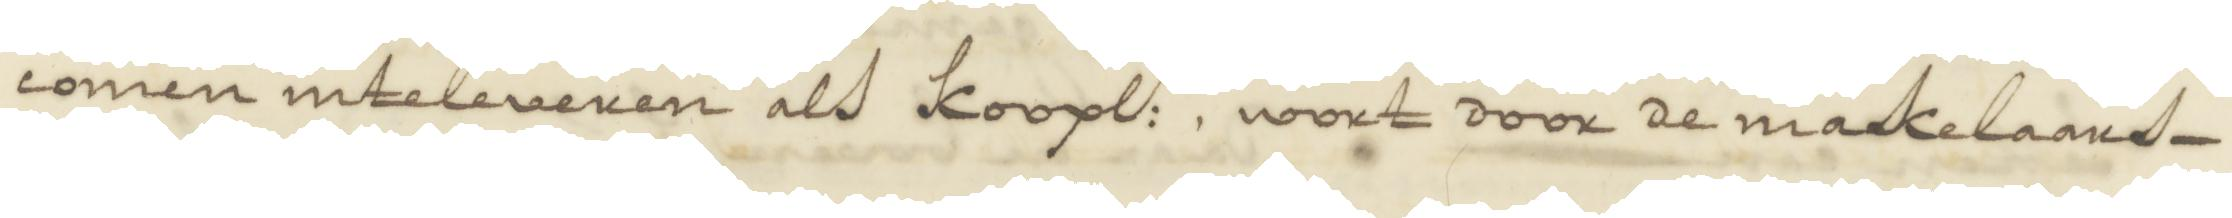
comen inteleveren als kooplijk, wort door de makelaars
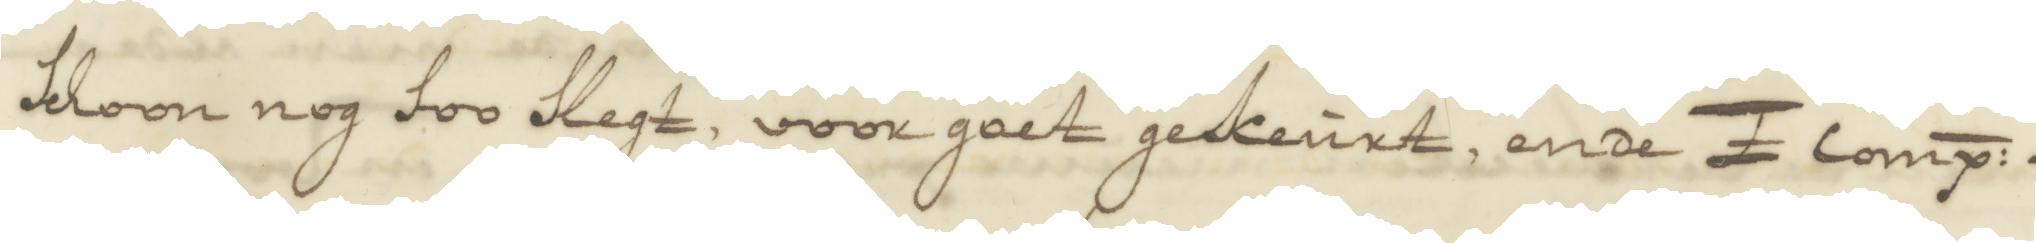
schoon nog soo slegt, voor goet gekeurt, ende E Comp:
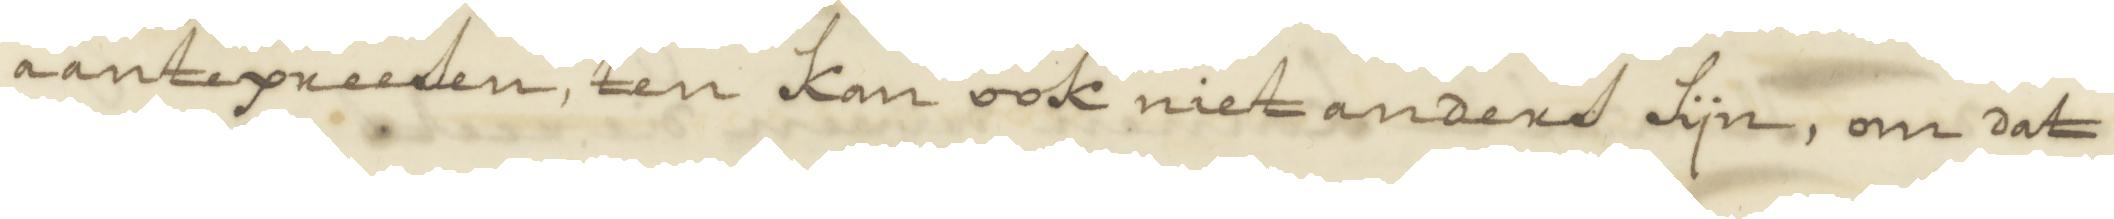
aantepreesen, ten kan ook niet anders sijn, om dat
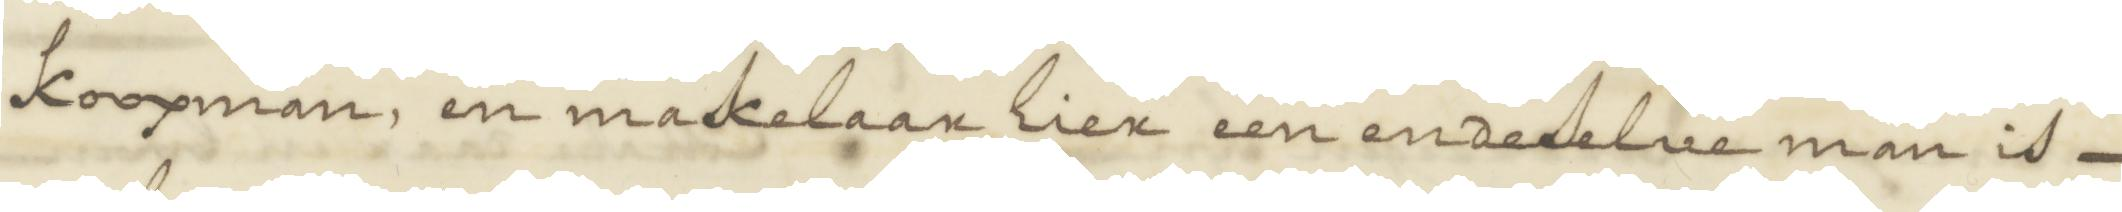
koopman, en makelaar hier een en deselve man is
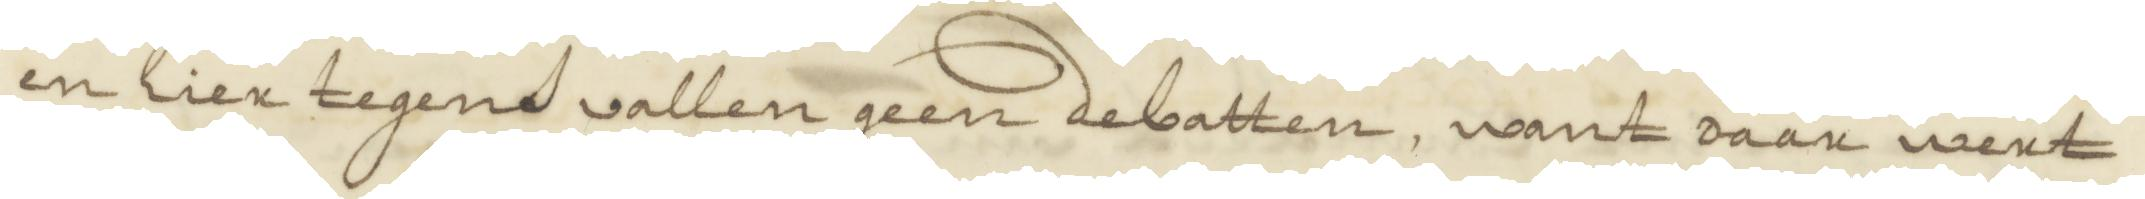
en hier tegens vallen geen debatten, want daar wert
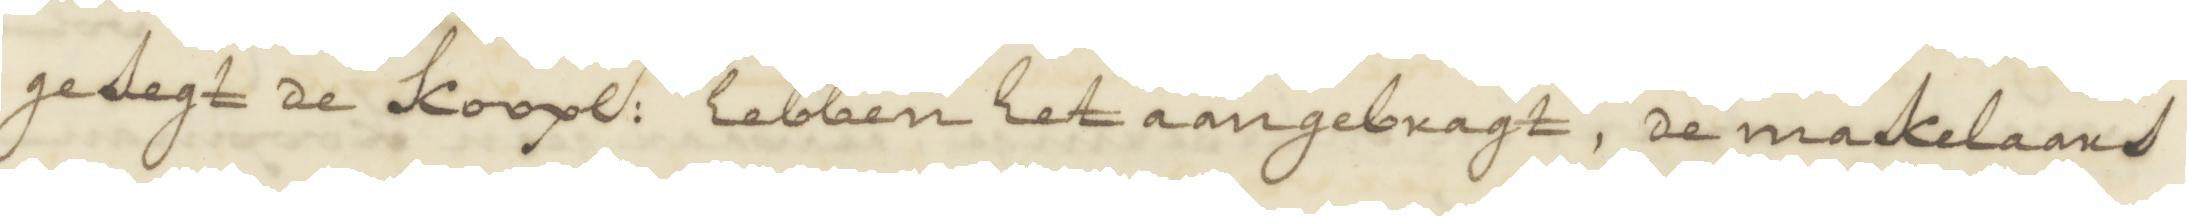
gesegt de kooplijk hebben het aangebragt, de makelaars
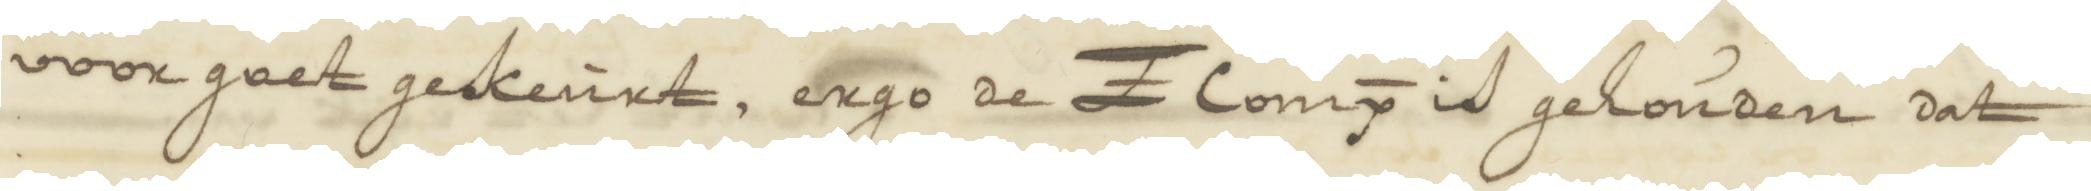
voor goet gekeurt, ergo de E Comp is gehouden dat
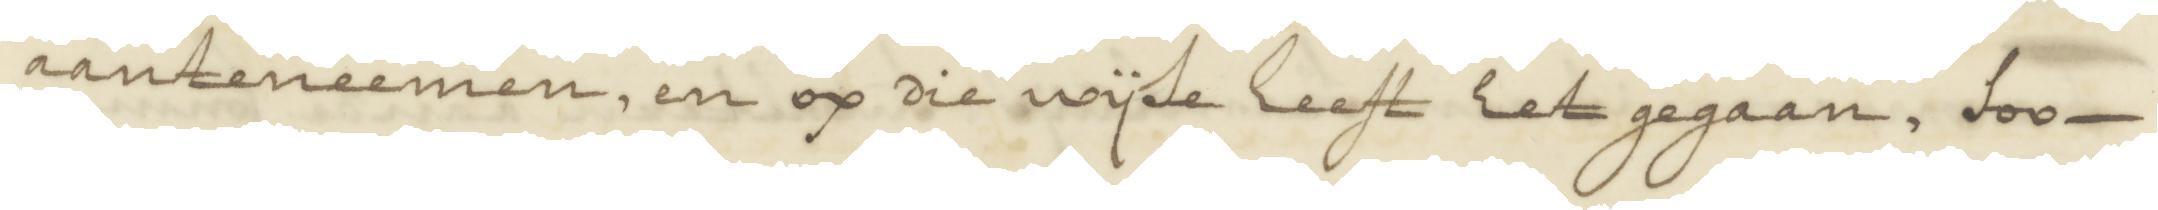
aanteneemen, en op die wijse heeft het gegaan, soo
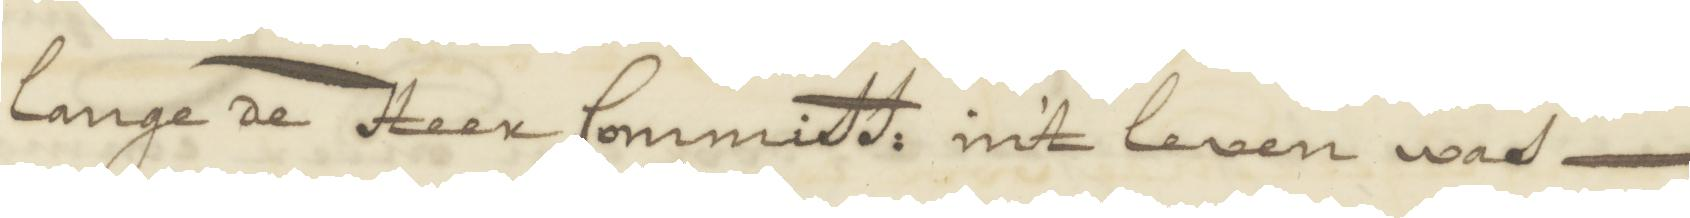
lange de Heer Commiss: in't leven was
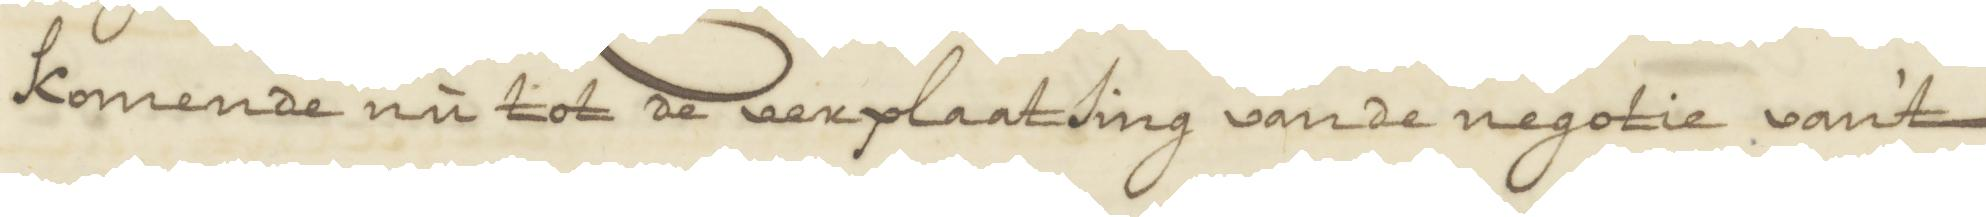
komende nu tot de veerplaatsing vande negotie van’t
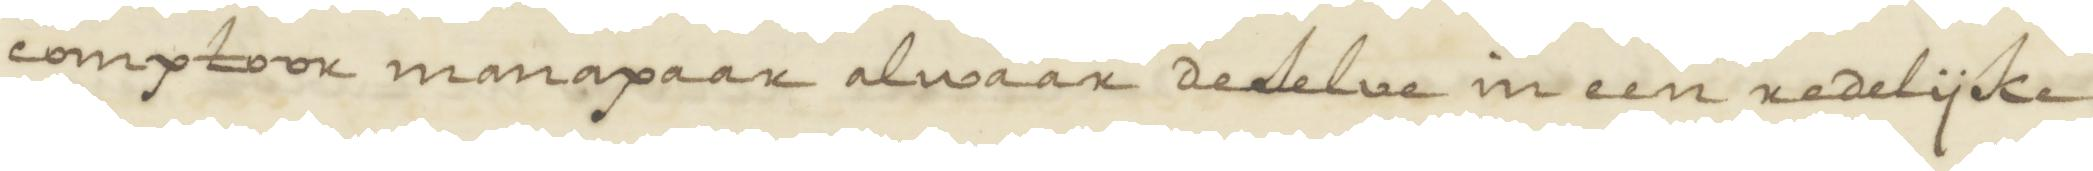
comptoor manapaar alwaar deselve in een redelijke
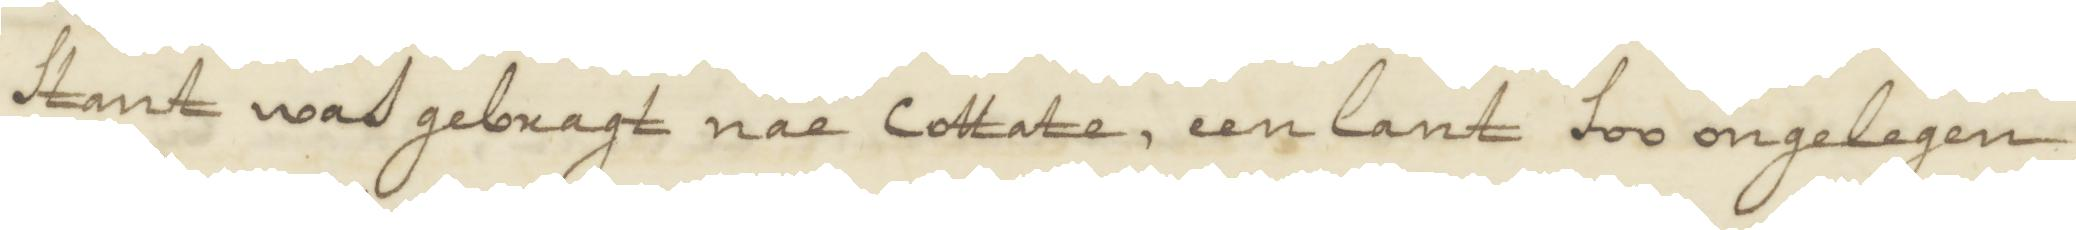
stant was gebragt nae cottate, een lant soo ongelegen
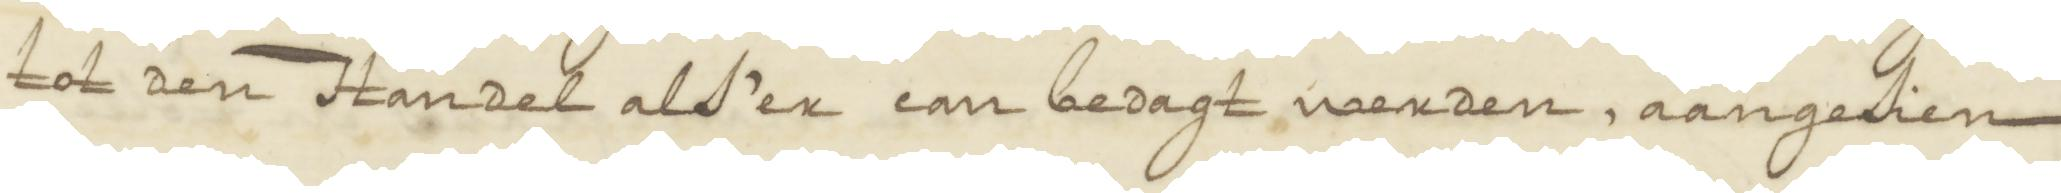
tot den Handel als 'er can bedagt werden, aangesien
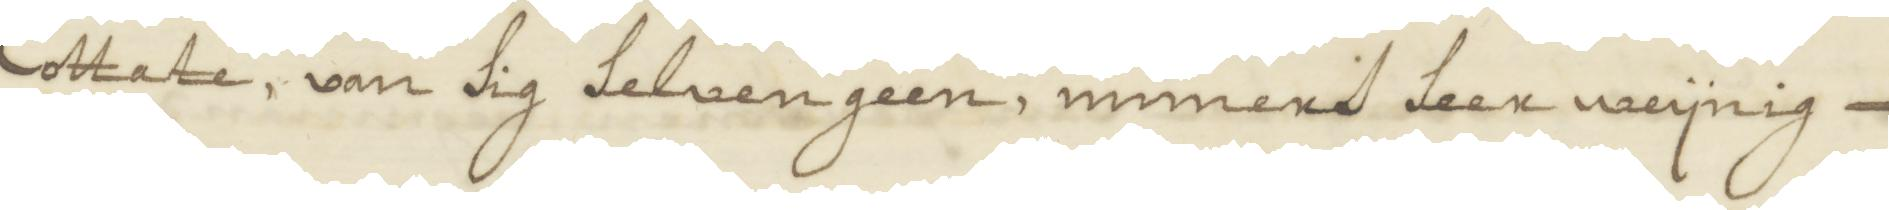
cottate, van sig selven geen, immers seer weijnig
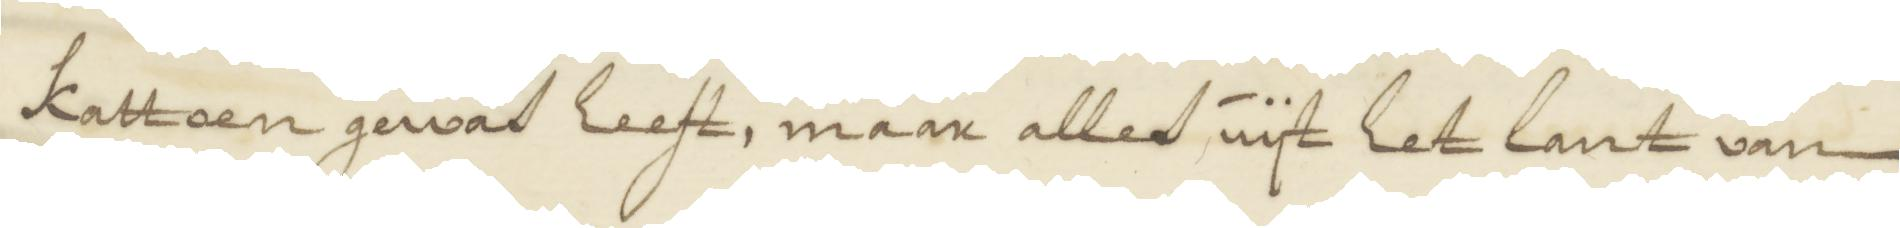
kattoen gewas heeft, maar alles uijt het lant van
